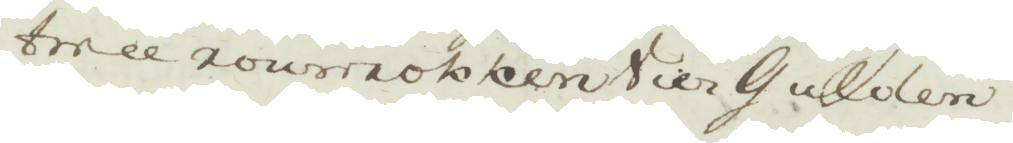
twee rouwrokken Vier Gulden
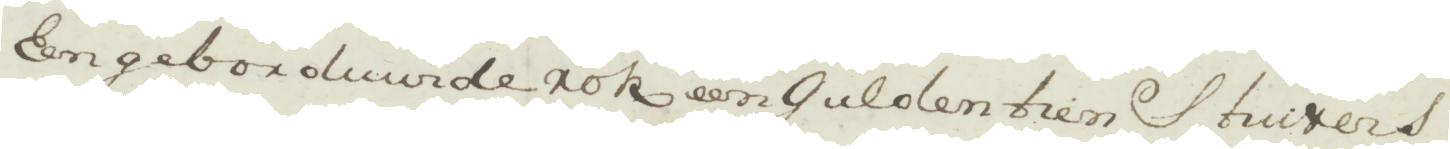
Een geborduurde rok een Gulden tien stuivers
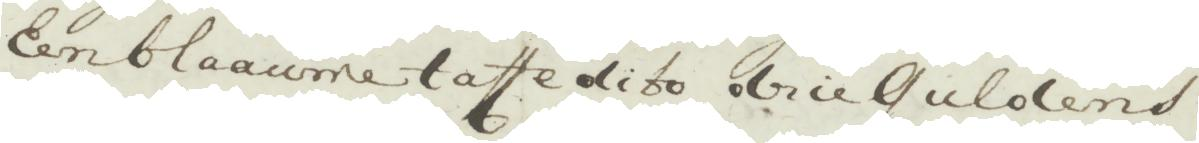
Een blaauwe taffe dito drie Guldens
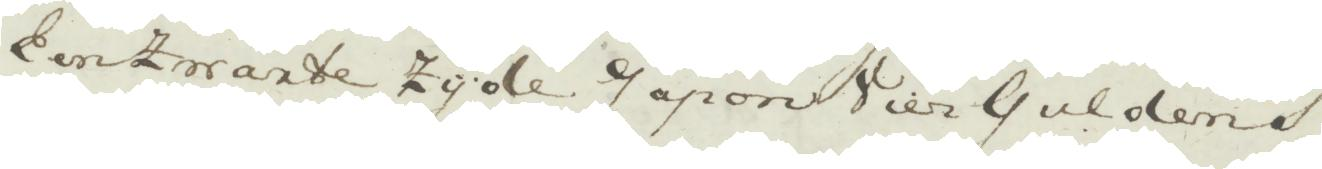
Een zwarte zijde Japon Vier Guldens
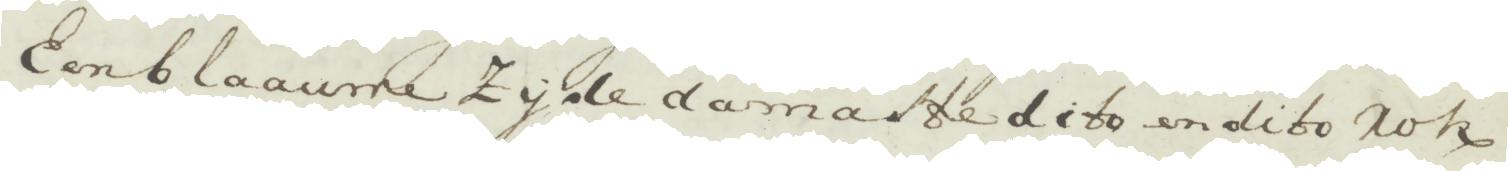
Een blaauwe zijde damaste dito en dito rok
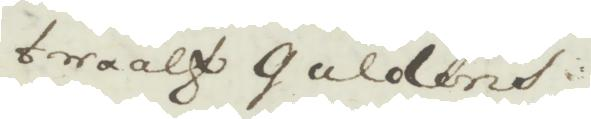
twaalf Guldens
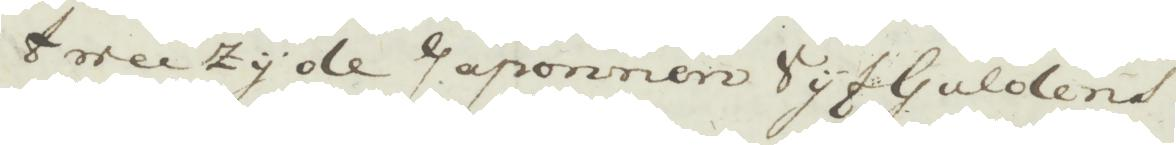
twee zijde Japonnen Vijf Guldens
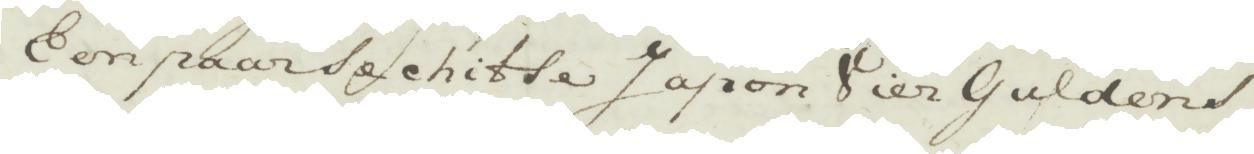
Een paarse chitse Japon Vier Guldens
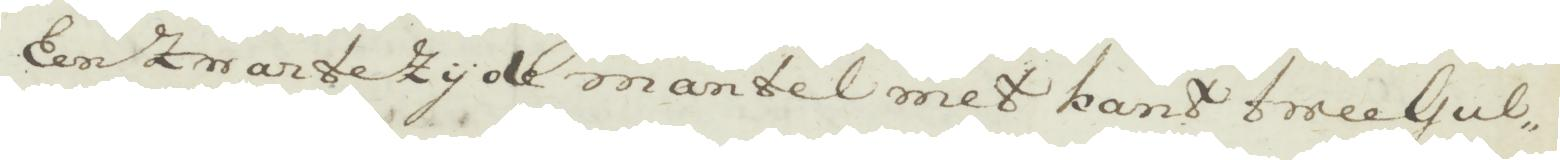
Een zwarte zijde mantel met kant twee Gul„
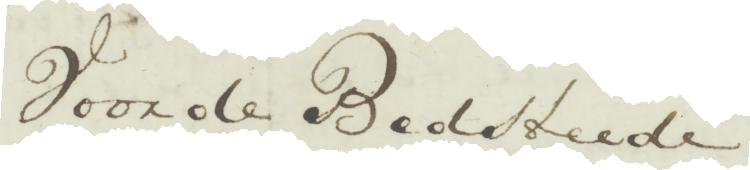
Voor de Bedsteede
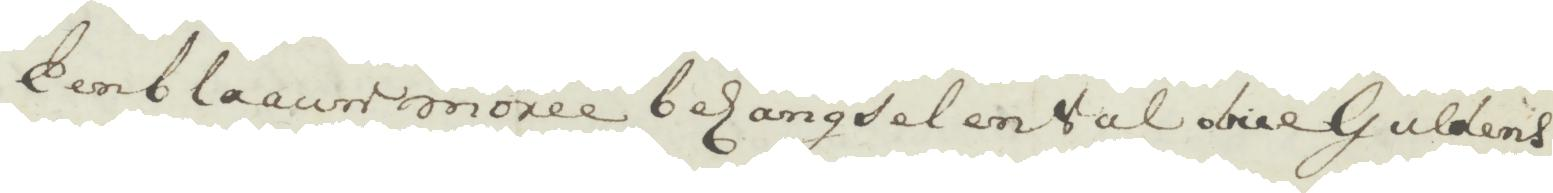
Een blaauw moree behangsel en val drie Gulden
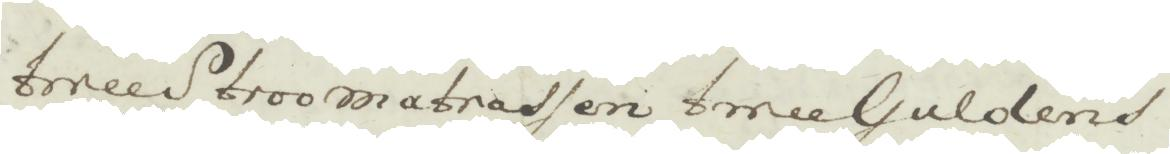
twee stroo matrassen twee Guldens
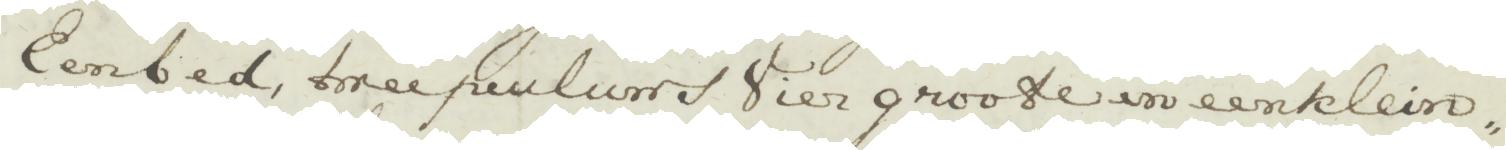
Een bed, twee peuluws Vier groote en een klein„
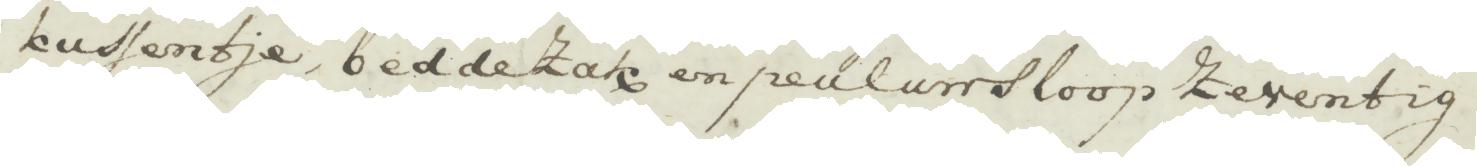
kussentje, beddezak en peuluwsloop Zeventig
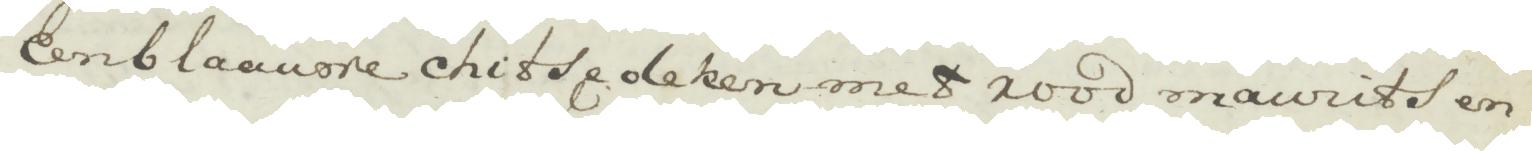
Een blaauwe chitse deken met rood maurits en
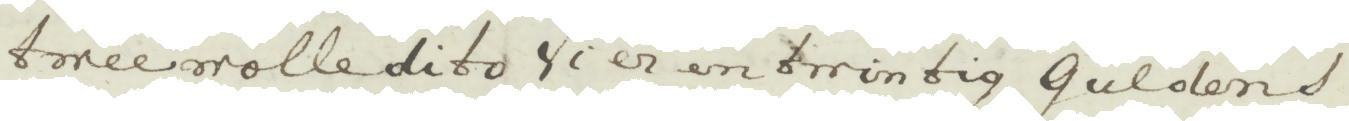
twee wolle dito Vier en twintig Guldens
